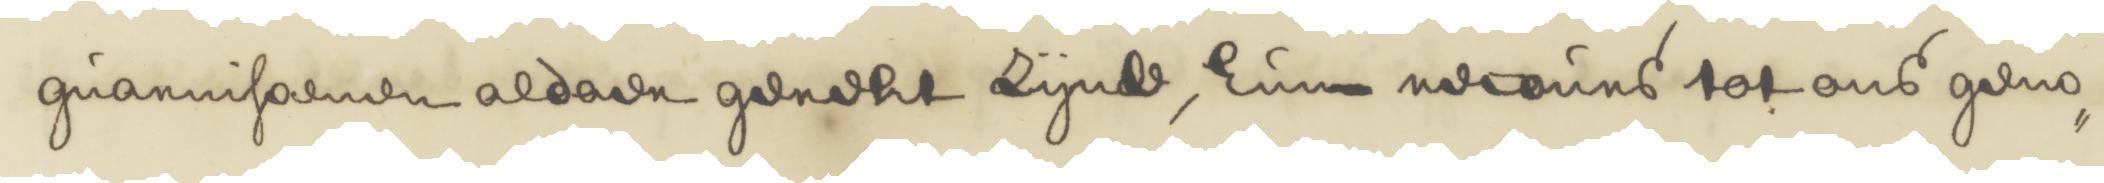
guarnisoenen aldaer gerekt zijnde, hun recours tot ons geno„
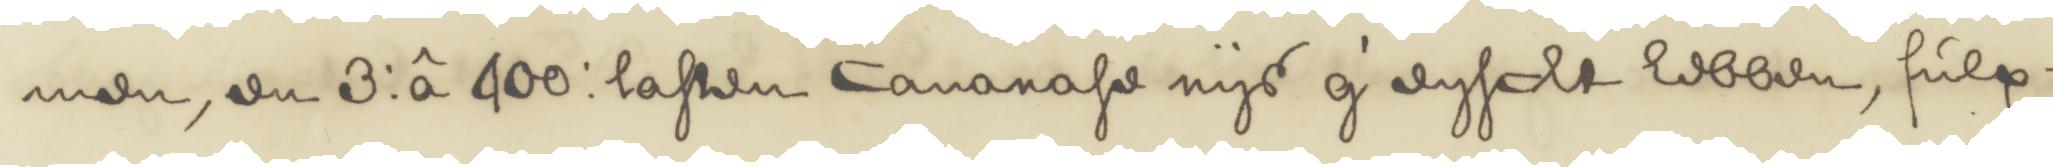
men, en 3: â 400: lasten Canarase rijs g’eyscht hebben, sulx
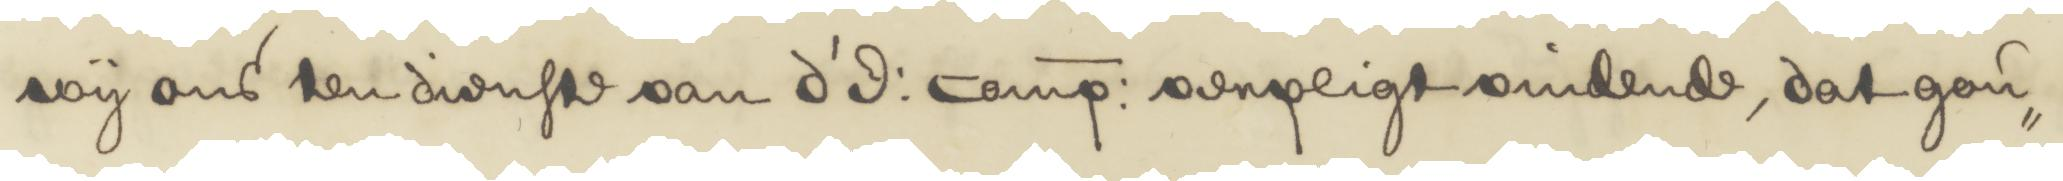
wij ons ten dienste van d’E: comp: verpligt vindende, dat gou„
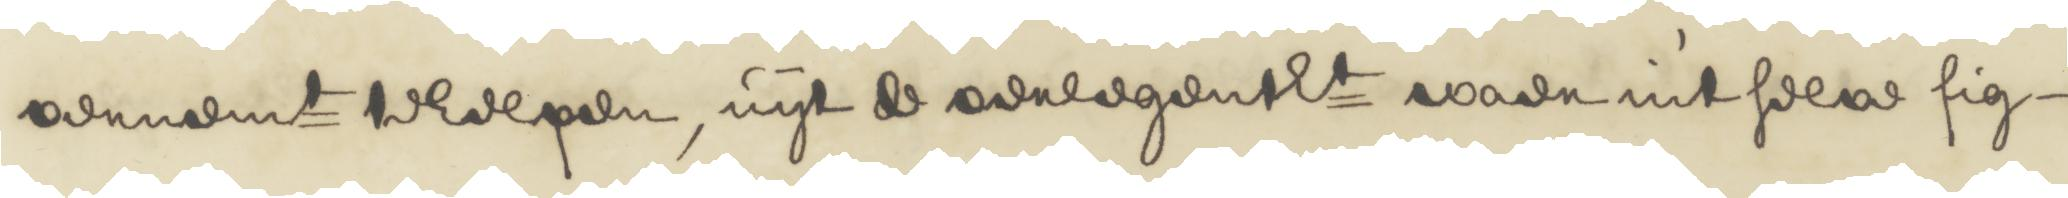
vernem=t tehelpen, uijt de verlegenth=t waer in’t selve sig
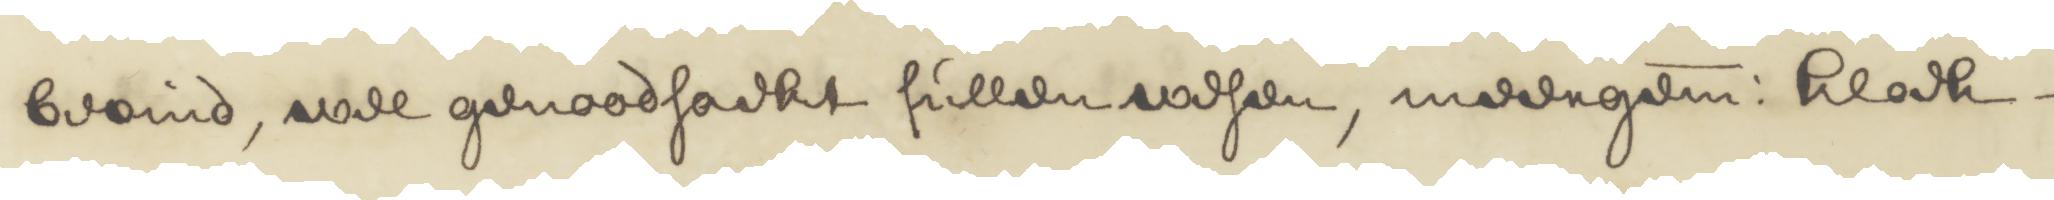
bevind, wel genoodsaekt sullen wesen, meergem: kloek
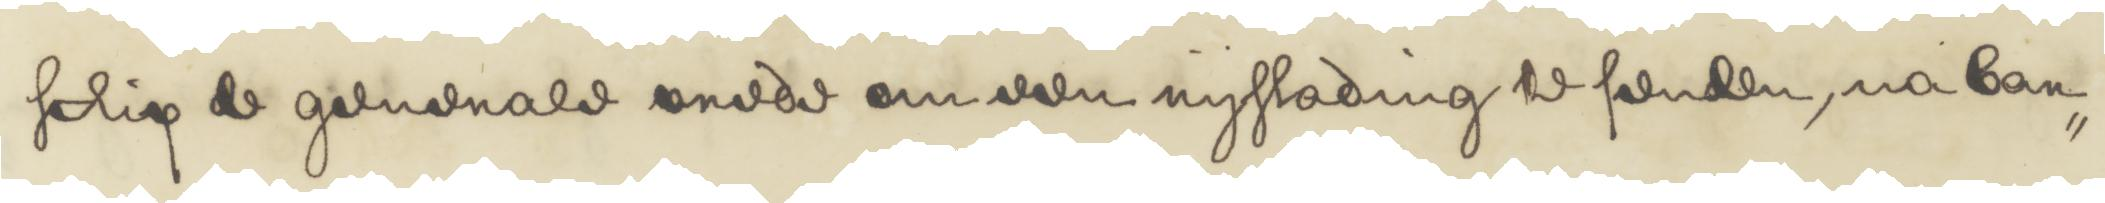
schip de generale vrede om een rijslading te senden, na bar„
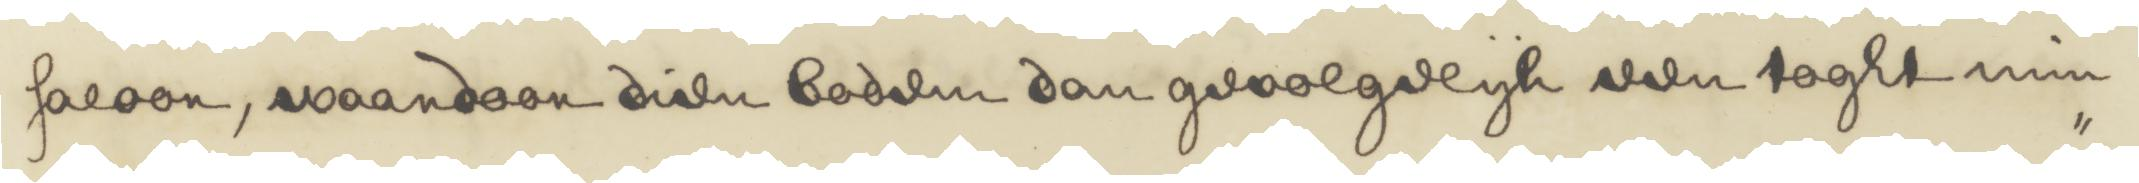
saloor, waardoor dien bodem dan gevolgelijk een toght min„
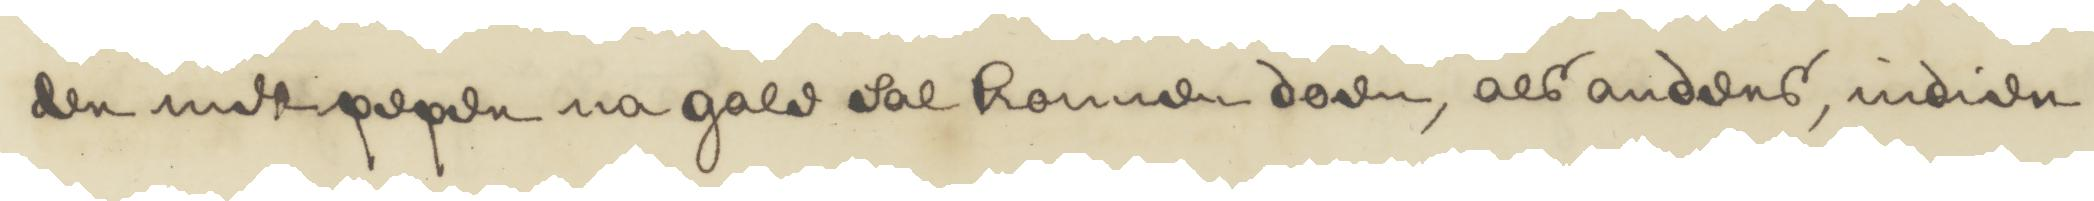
der met peper na gale sal konnen doen, als anders, indien
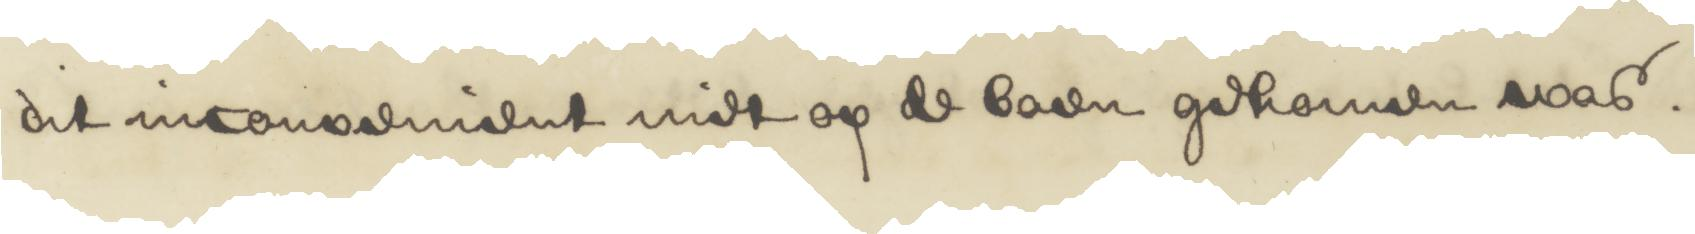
dit inconvenient niet op de baer gekomen was.
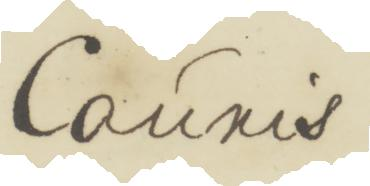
Couris
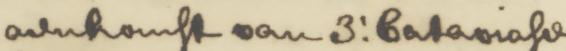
aenkomst van 3: bataviase
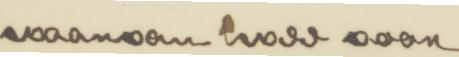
waarvan twee voor
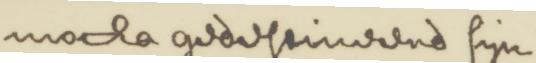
mocha gedestineerd sijn
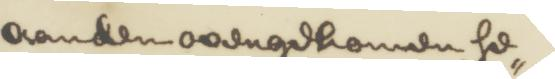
aanden overgekomen se„
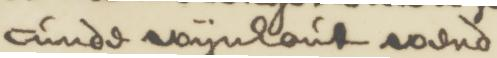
cunde wijnhout werd
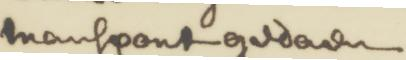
transport gedaen
